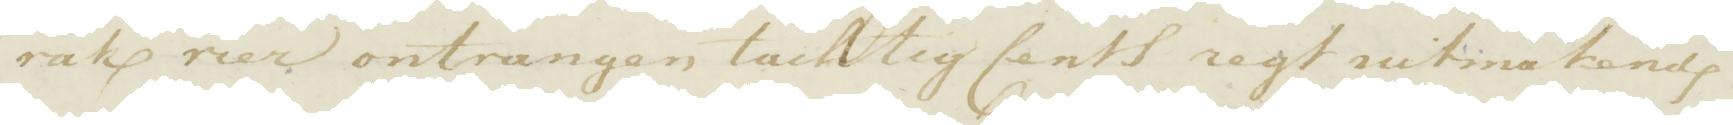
vak vier ontvangen tachtig Cents regt uitmakende
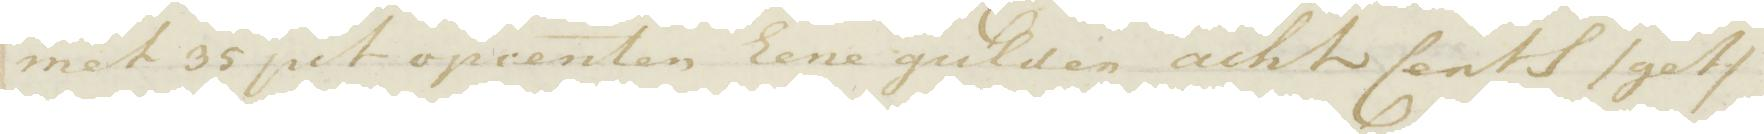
met 35 pct opcenten Eene gulden acht Cents /get/
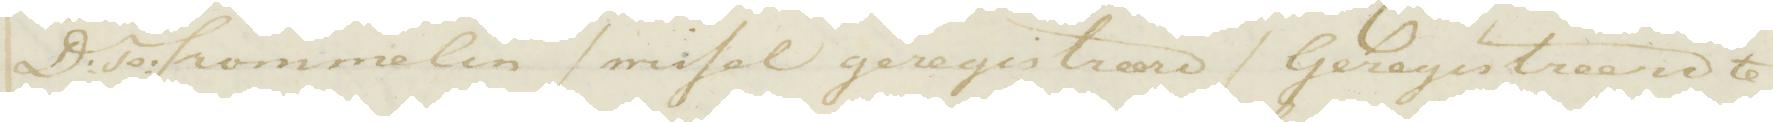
D:F: Crommelin /wissel geregistreerd / Geregistreerd te
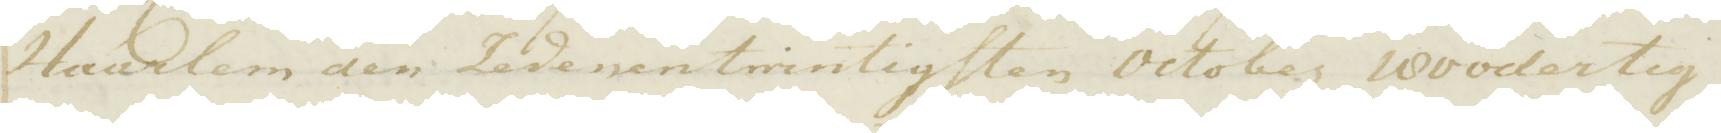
Haarlem den Zevenentwintigsten October 1800 dertig
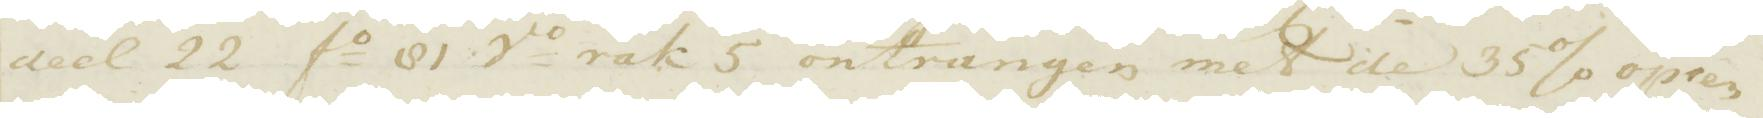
deel 22 f=o 81: v=o vak 5 ontvangen met de 35% opcen
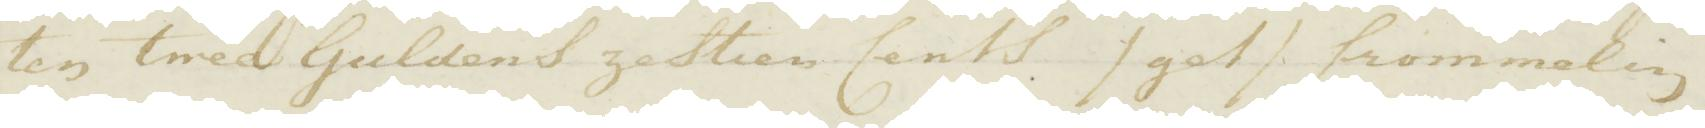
ten twee Guldens zestien Cents /get/ Crommelin
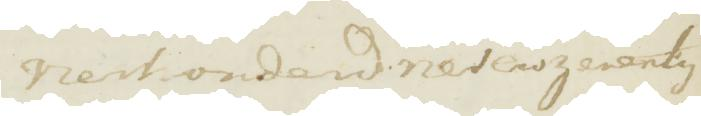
vierhonderd vier en zeventig
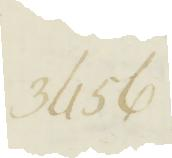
3456
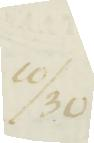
10/30
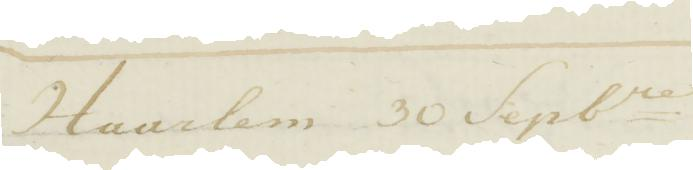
Haarlem 30 Sepb=re
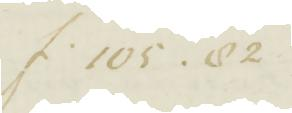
ƒ 105.82
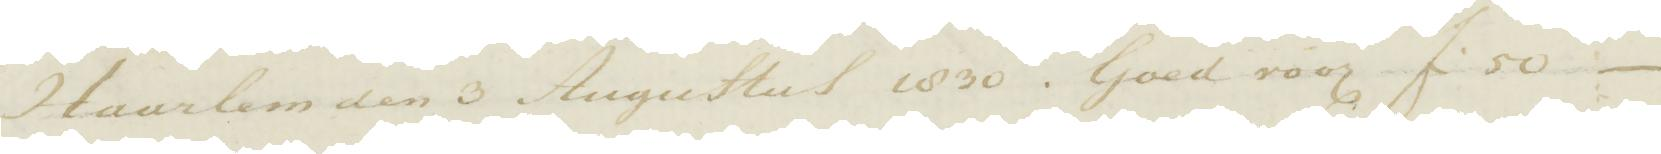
Haarlem den 3 Augustus 1830. Goed voor ƒ 50 —
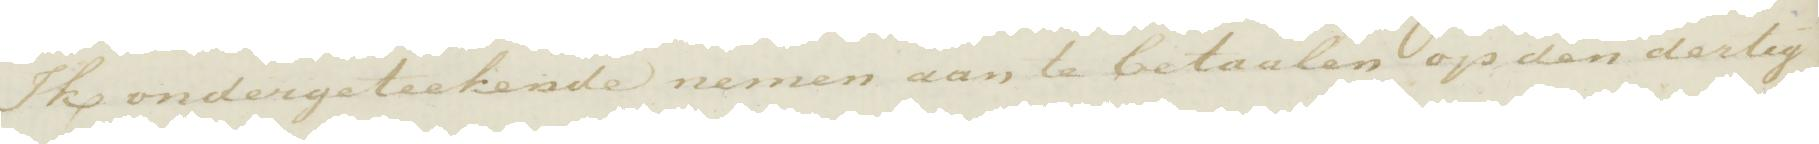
Ik ondergeteekende nemen aan te betaalen op den dertig
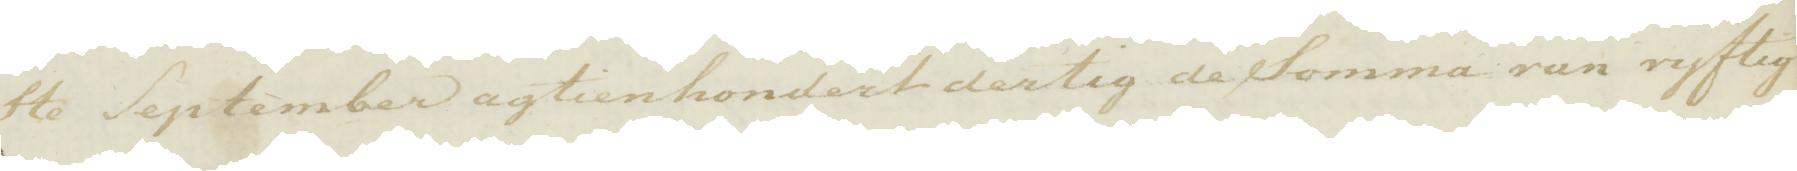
ste September agtienhondert dertig de somma van vyftig
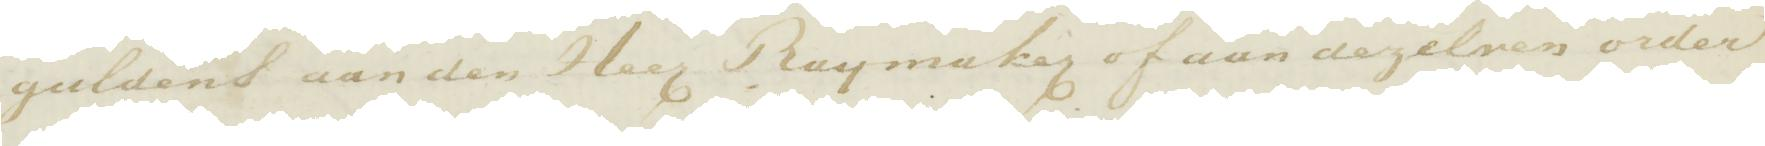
guldens aan den Heer Ruymaker of aan dezelven order
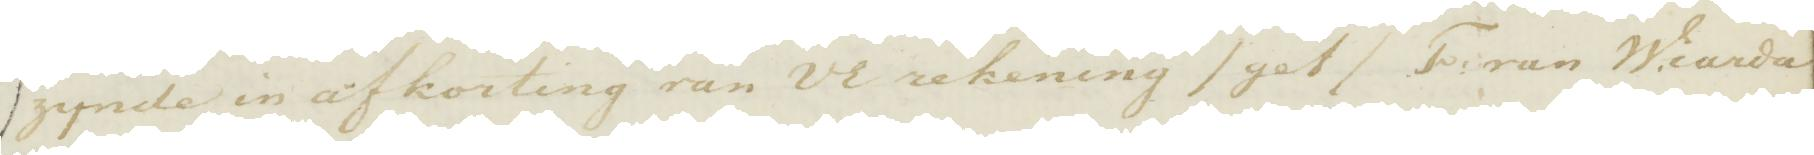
zynde in afkorting van UE rekening /get/ F: van Wiarda
